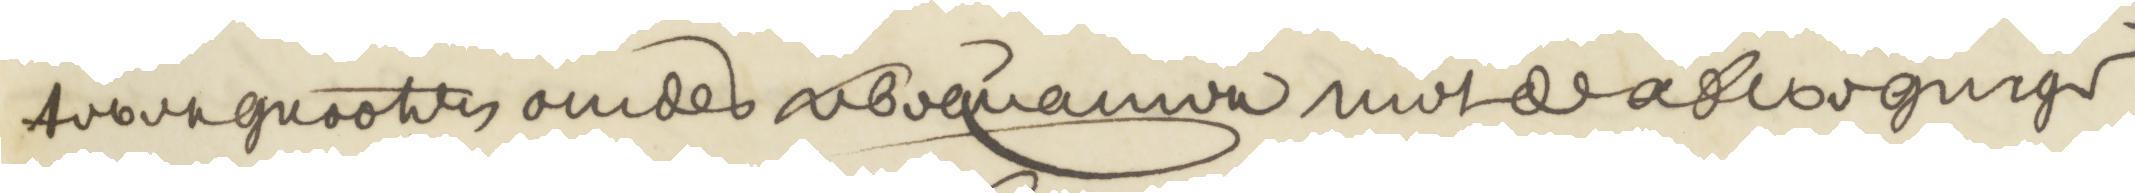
tevergrooten omdes tebequamer met de afweginge
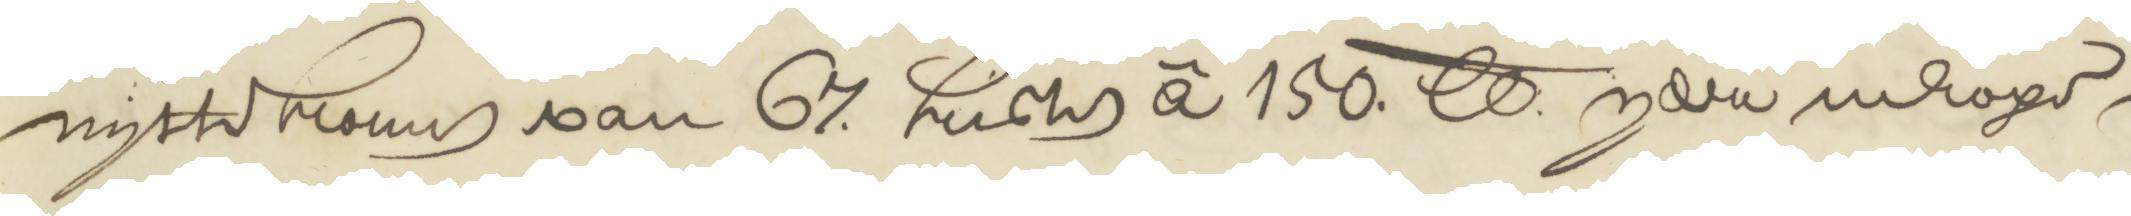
uijttekomen van 67. kisten â 150. lb: ijder inhope
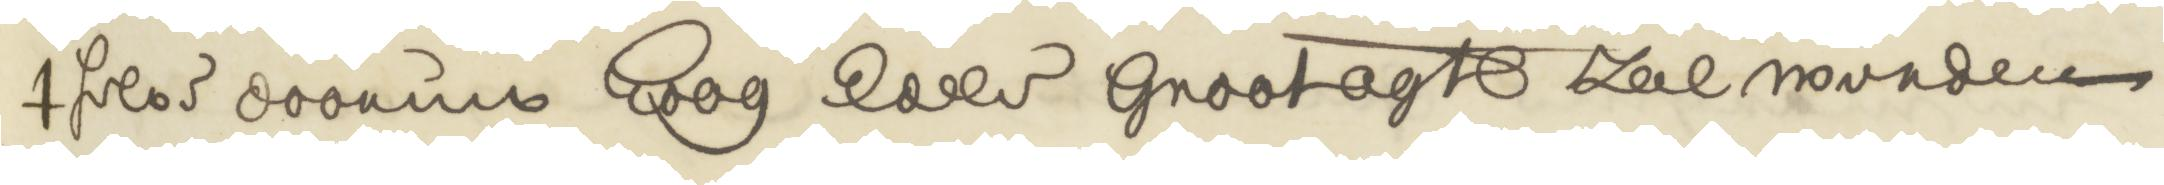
t selve door uw hoog Edele groot agtb zal werden
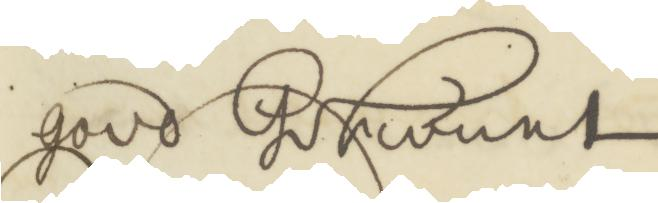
goed gekeurt
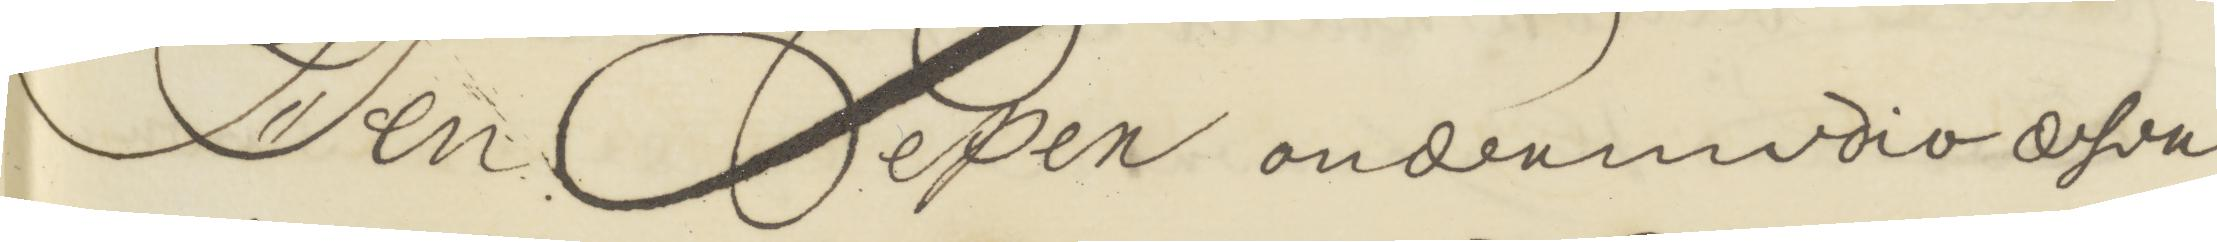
Den Peper onder medio deser
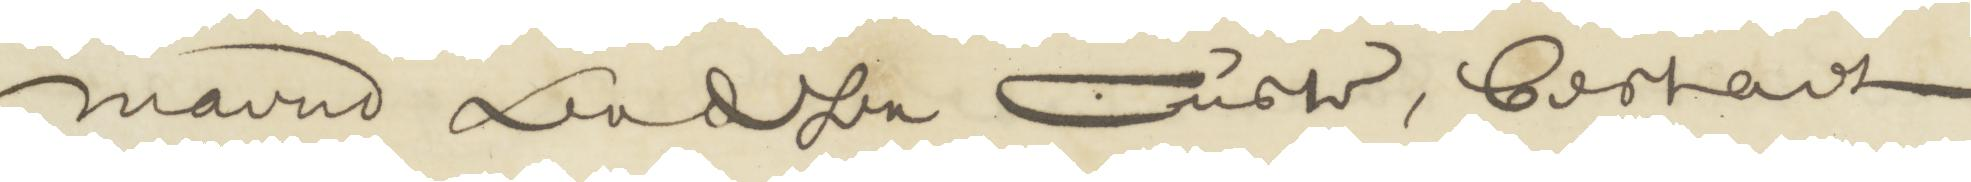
maend ter deser Custe, bestaet
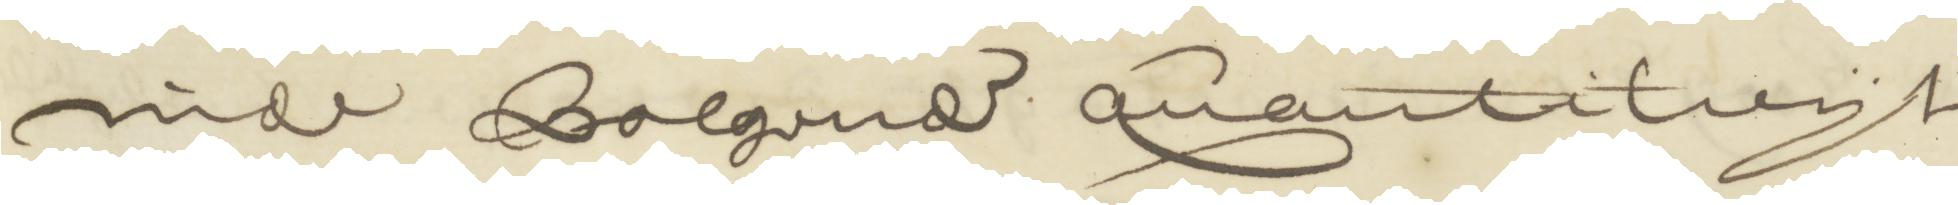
inde volgende quantiteijt
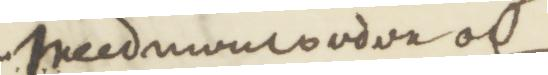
meed men weder over
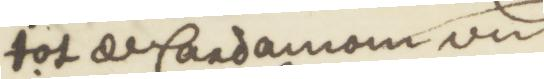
tot de Cardamom en
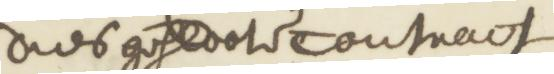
dies gesloote contract
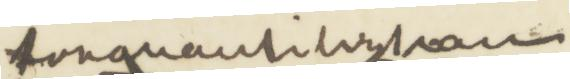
ter quantiteyt van
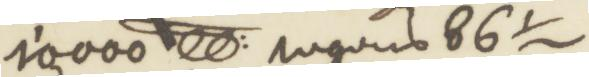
1'0000 lb: tegens 86½
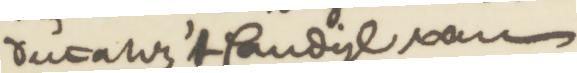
ducaten ’t Candijl van
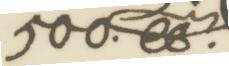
500. lb.
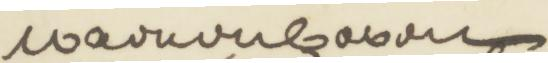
waeren boven
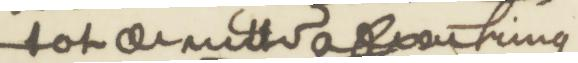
tot de nette afpacking
